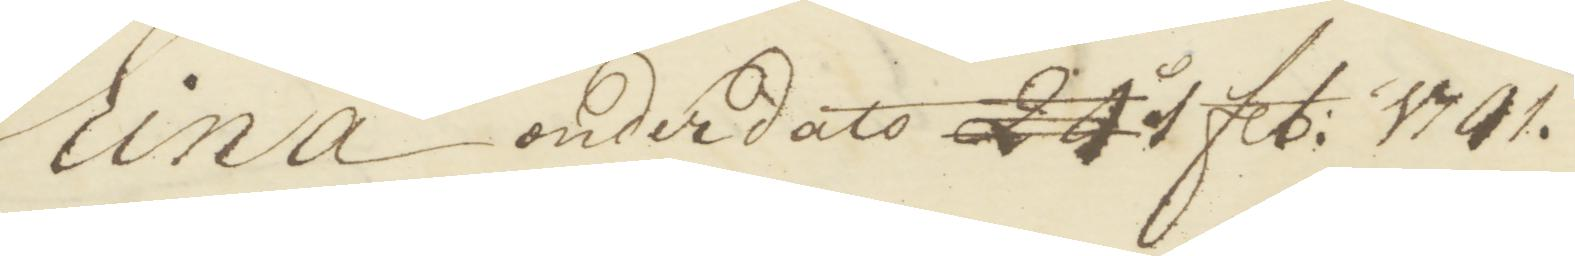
Van China onder dato 24' 1 feb: 1741.
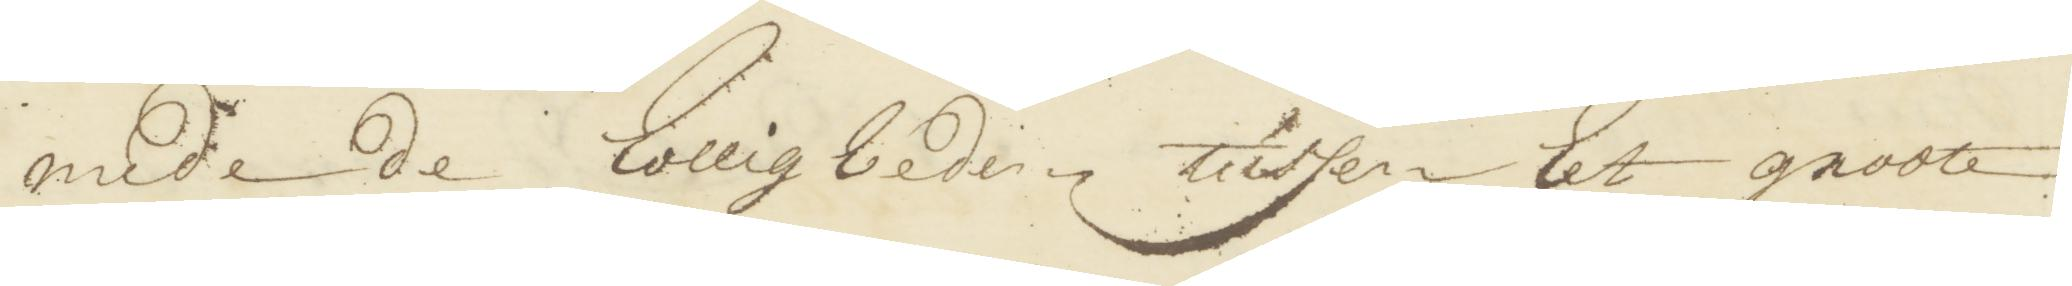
mede de holligheden tussen het groote
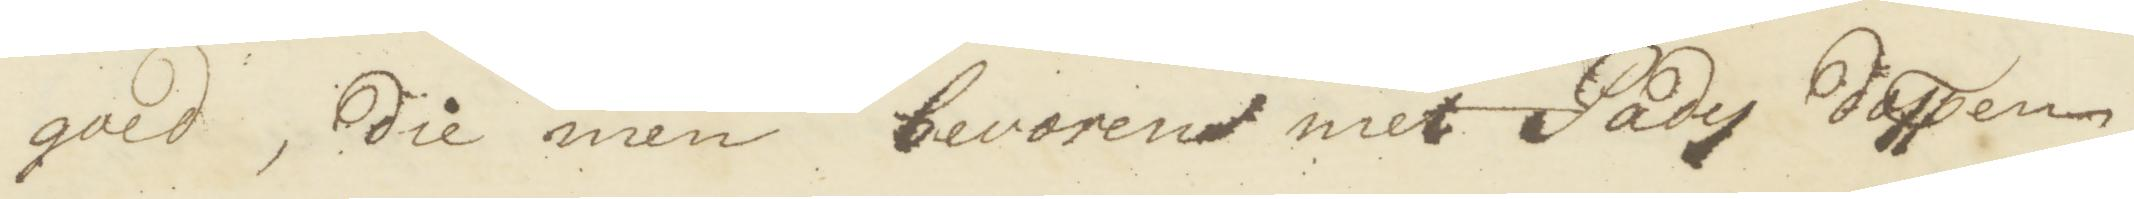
goed, die men bevorens met Pady doppen
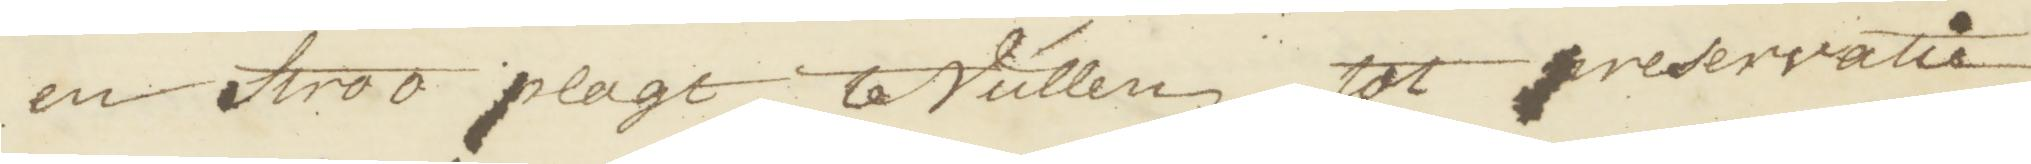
en stroo plagt te vullen tot preservatie
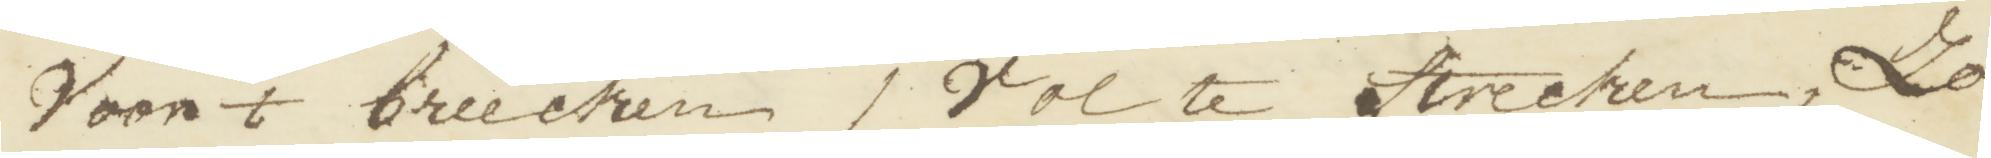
voor t breecken / vol te strecken, zo
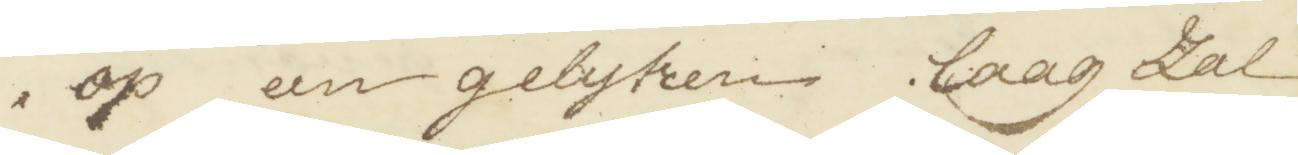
verre tot men , op een gelyken laag zal
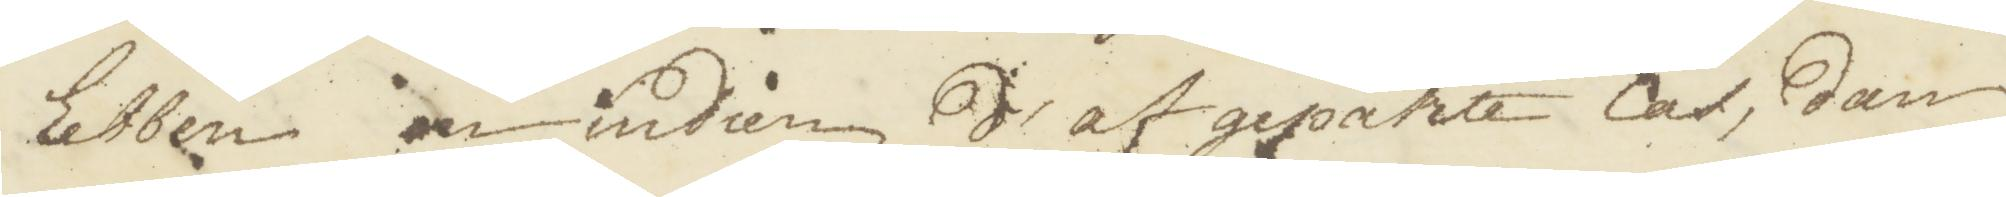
hebben en indien d' afgepakte cas, dan
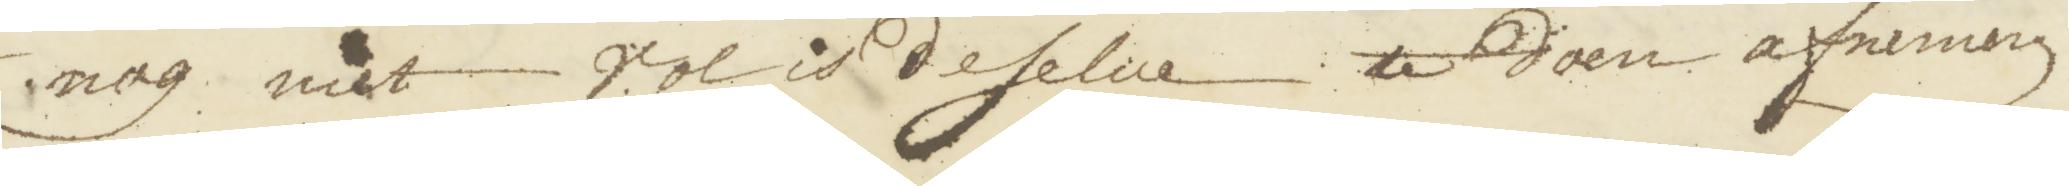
nog niet vol is deselve te doen afnemen
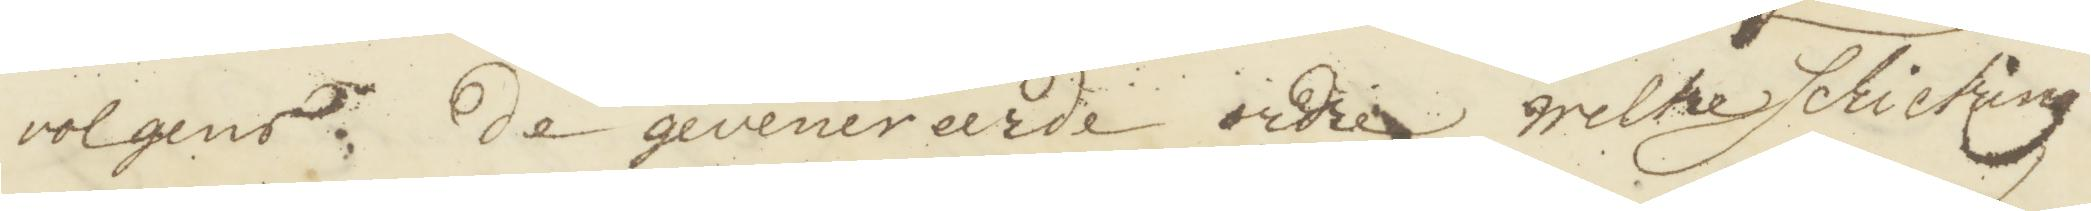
volgens de gevenereerde ordre welke schicking
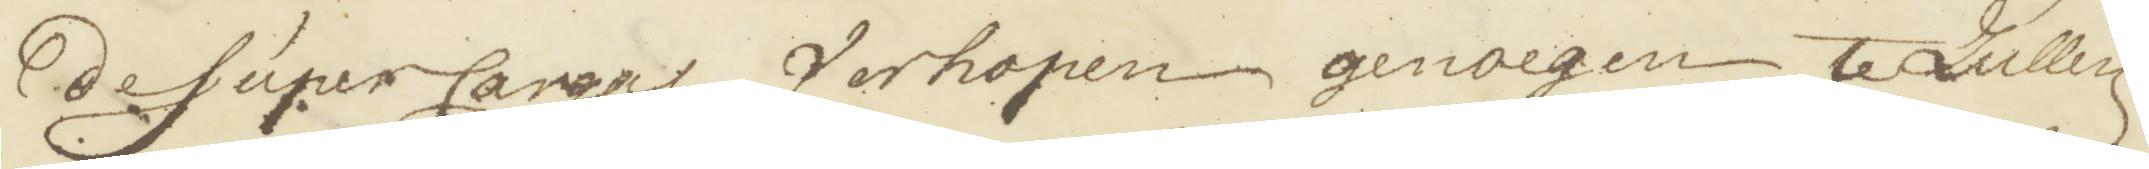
de supercargas verhopen genoegen te zullen
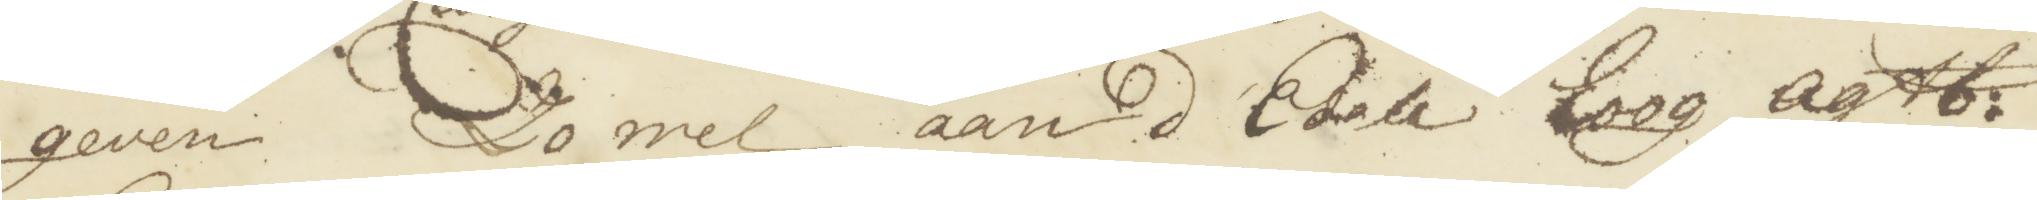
geven zo wel aan d’ Edele hoog agtb:
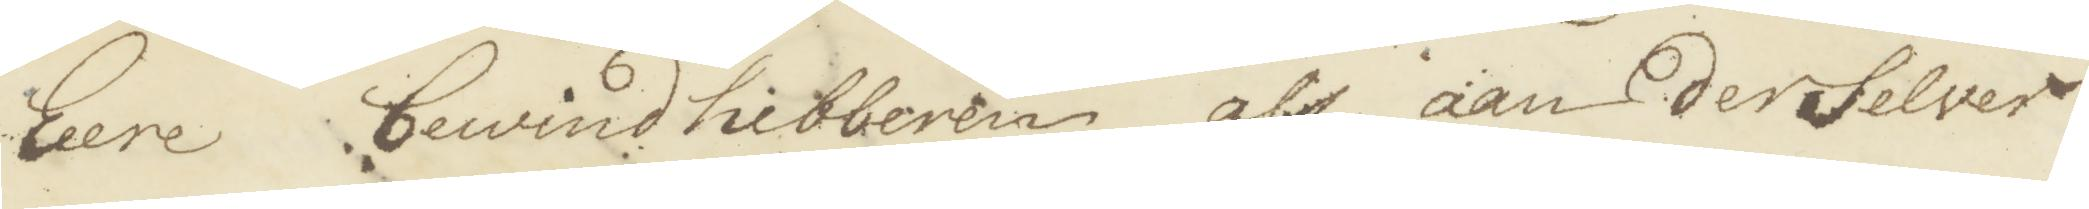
heere bewindhebberen als aan derselver
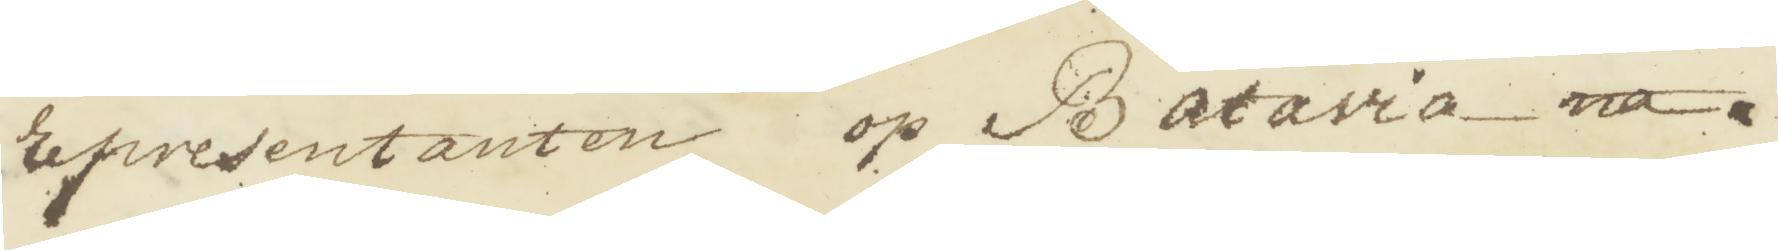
representanten op Batavia na.
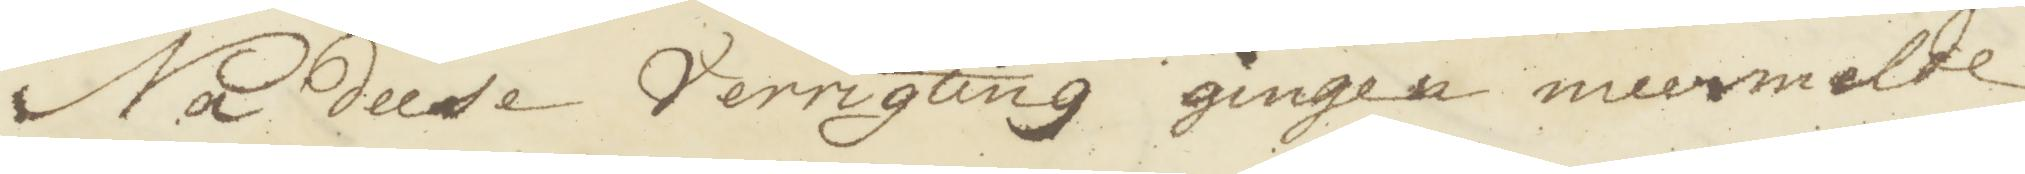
Na deese verrigting gingen meermelde
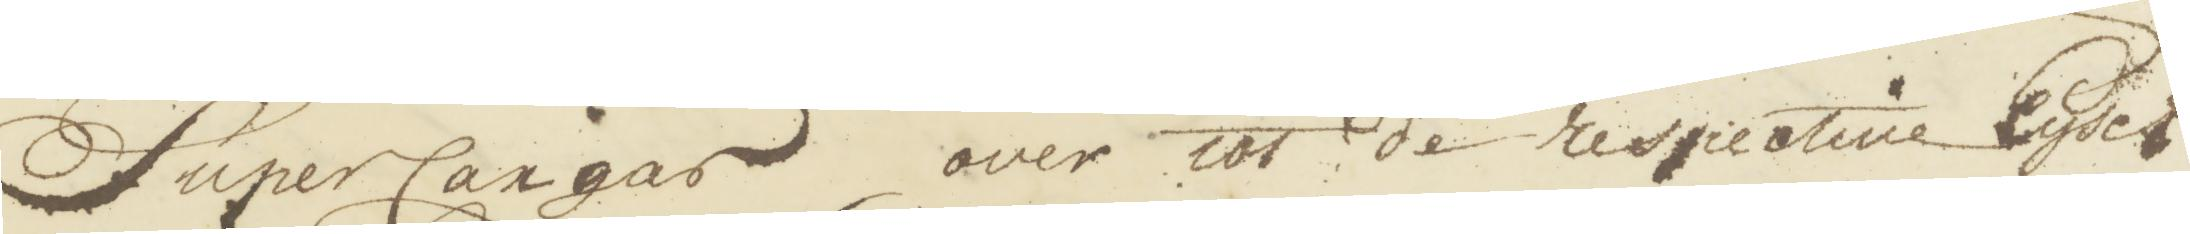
Supercargas over tot de respective Eysch
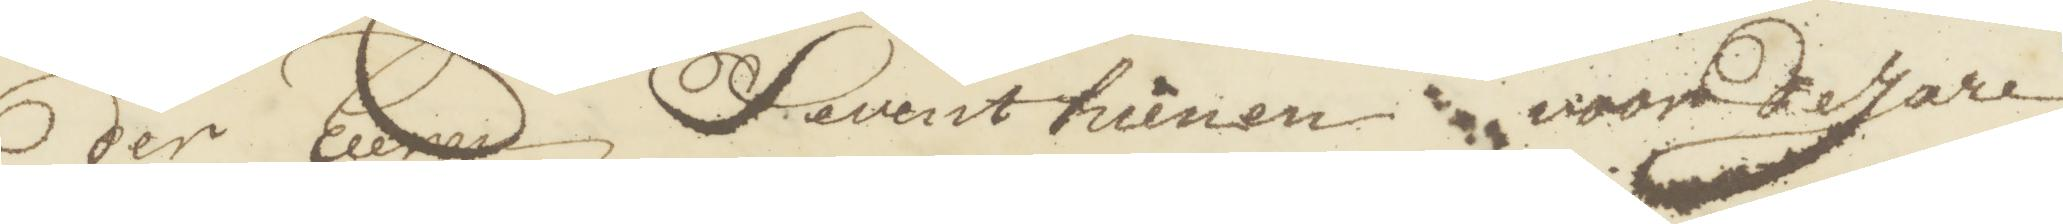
der heeren Seventhienen voor de Jare
